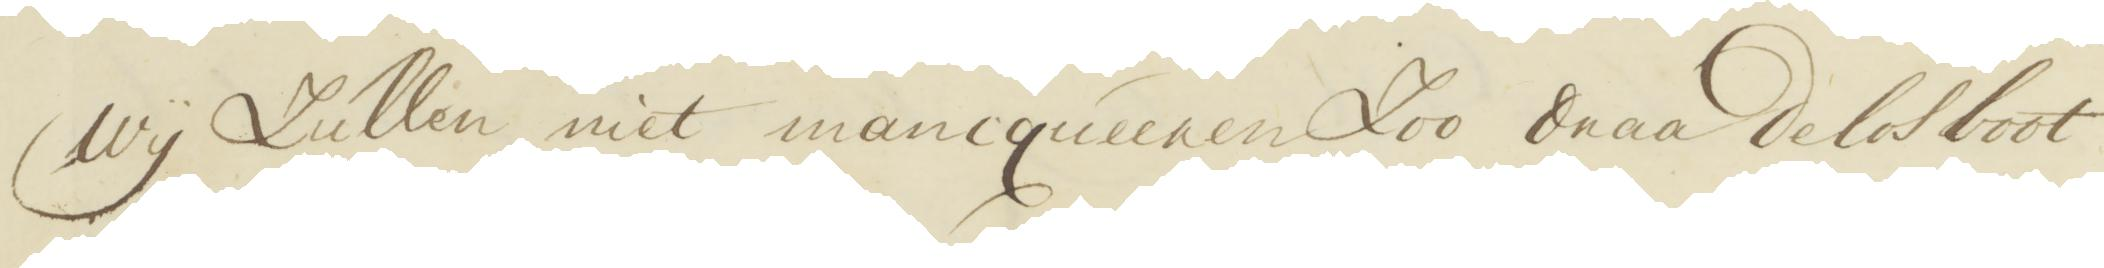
wij zullen niet mancqueeren zoo draa de los boot
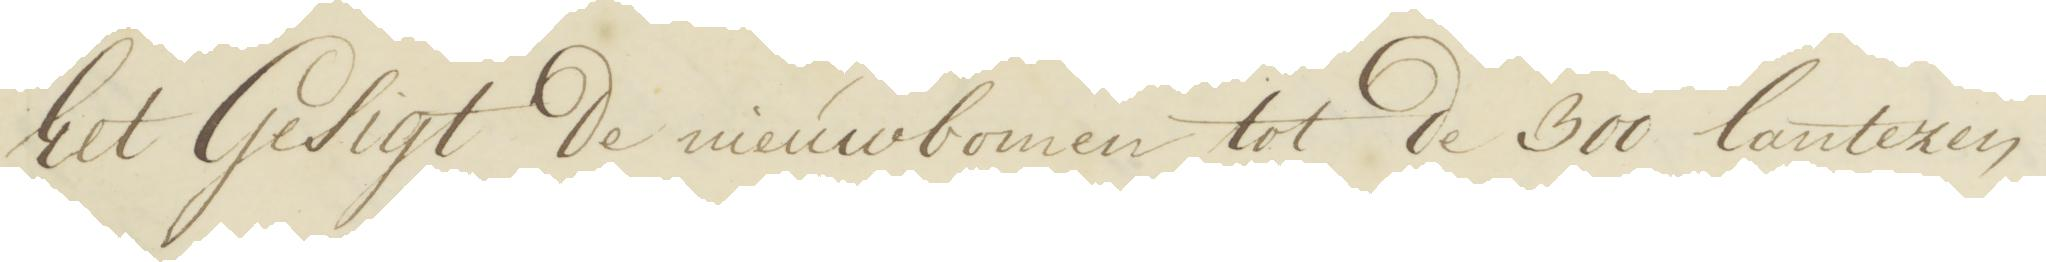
het Gesigt de nieuwbomen tot de 300 lantezen
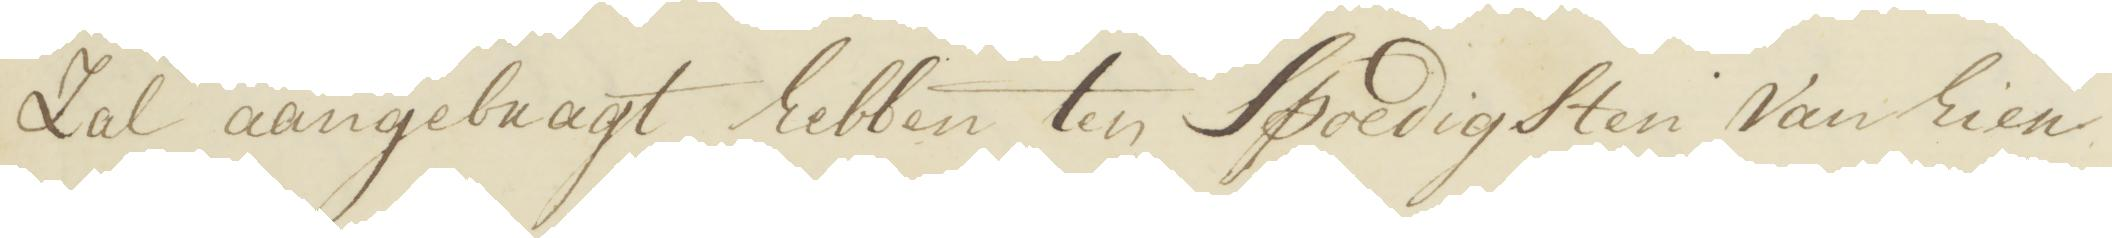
zal aangebragt hebben ten spoedigsten van hier
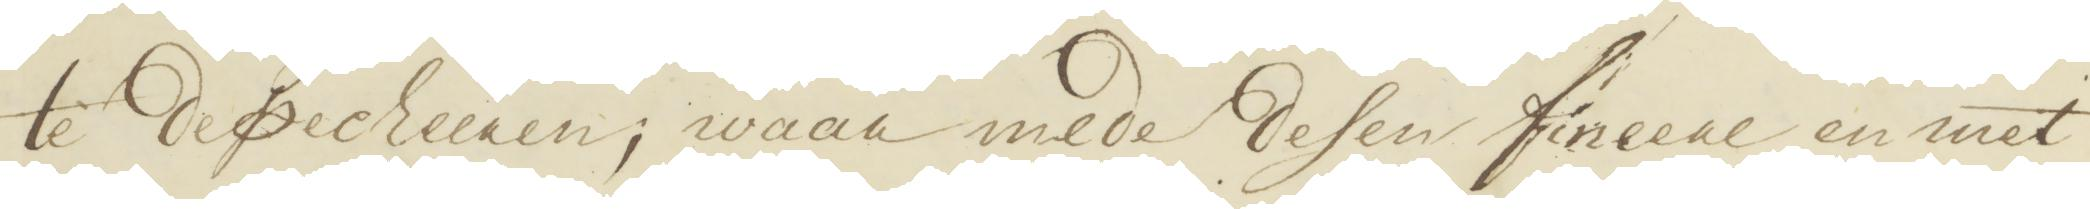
te depecheeren; waar mede desen fineere en met
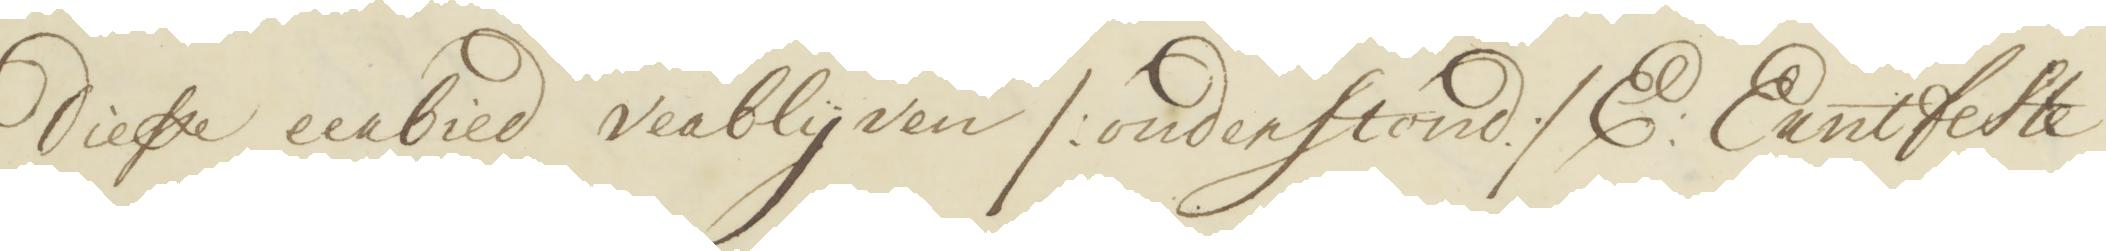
diepe eerbied verblijven /:onderstond:/ E: Erntfeste
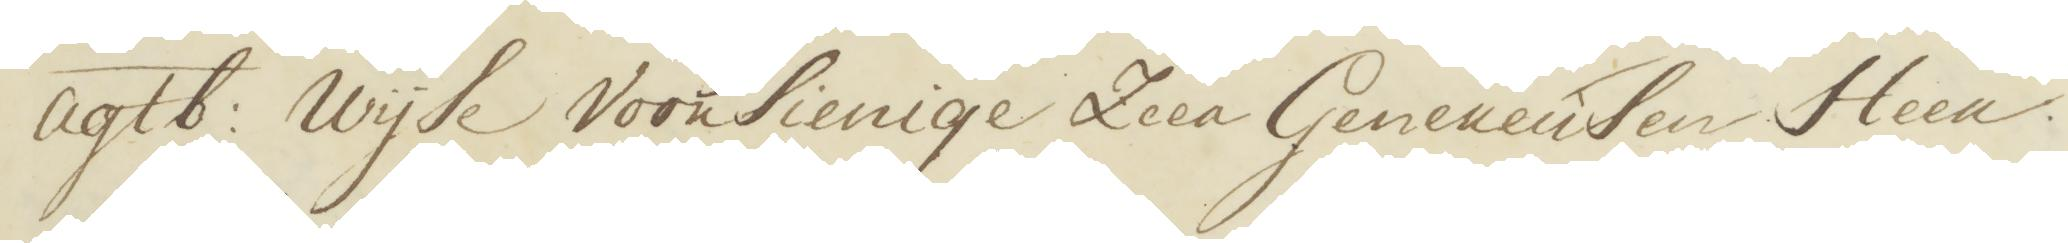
agtb: wijse voorsienige zeer Genereusen Heer
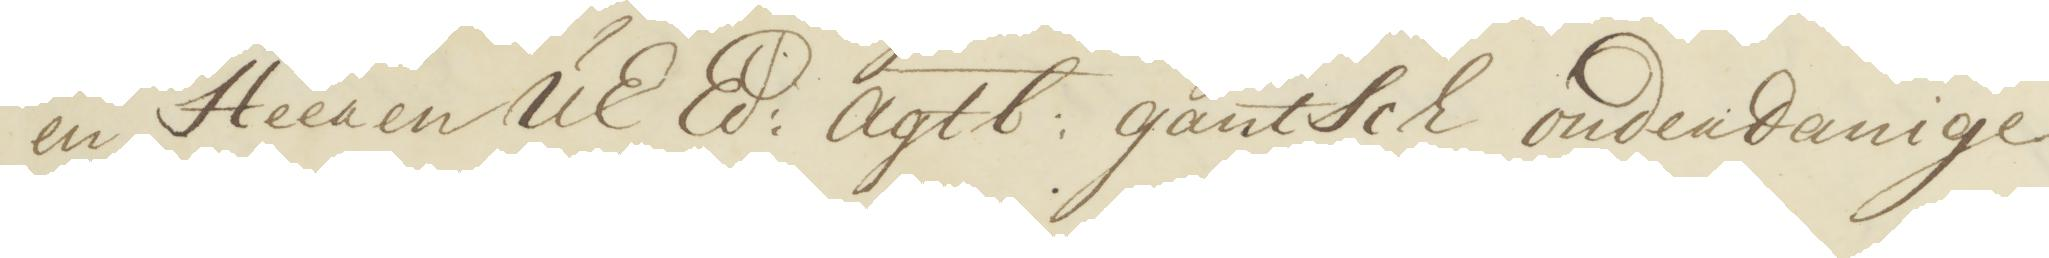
en Heeren UE: Ed: Agtb: gantsch onderdanige
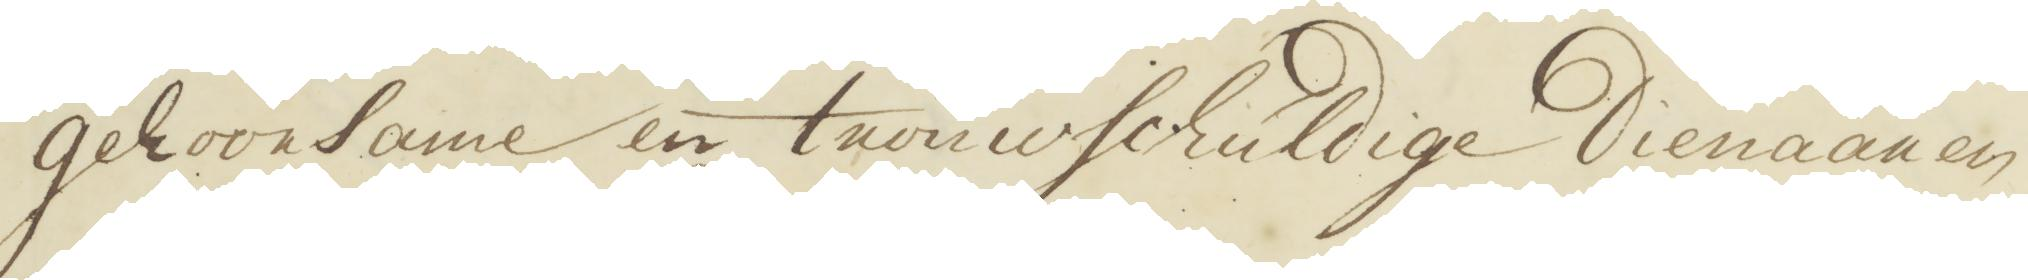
gehoorsame en trouwschuldige dienaaren
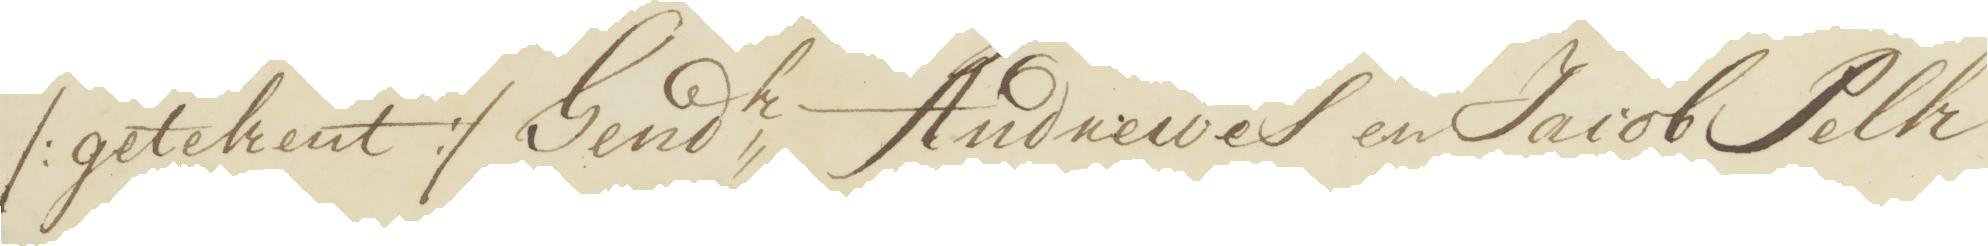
/:getekent:/ Hend„k Andrewes en Jacob Pelk
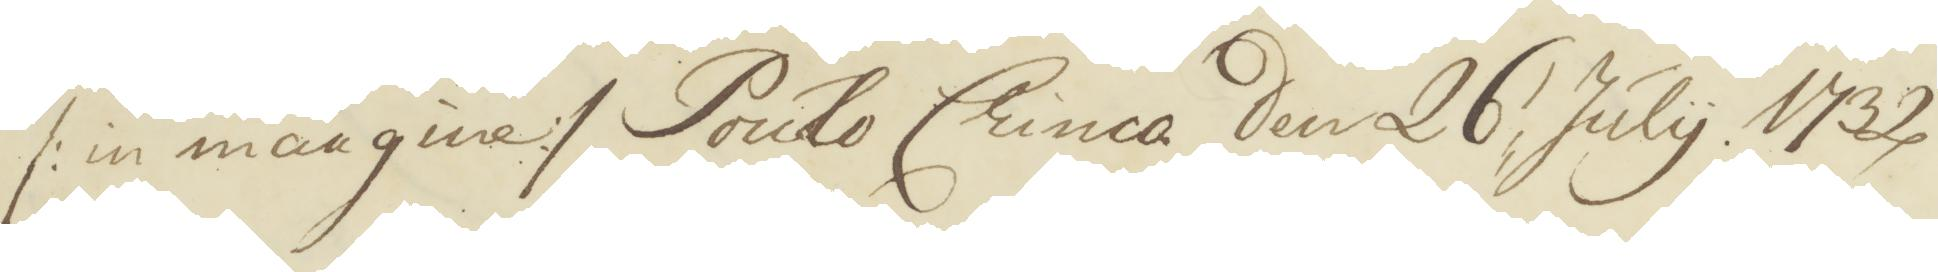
/:in maagine:/ Poulo Chinco den 26„' Julij. 1732
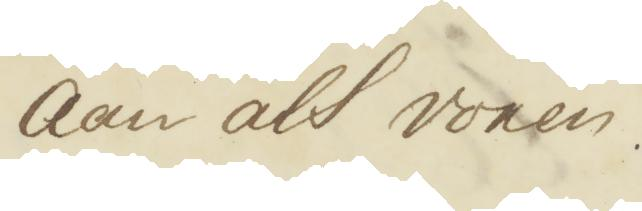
aan als voren.
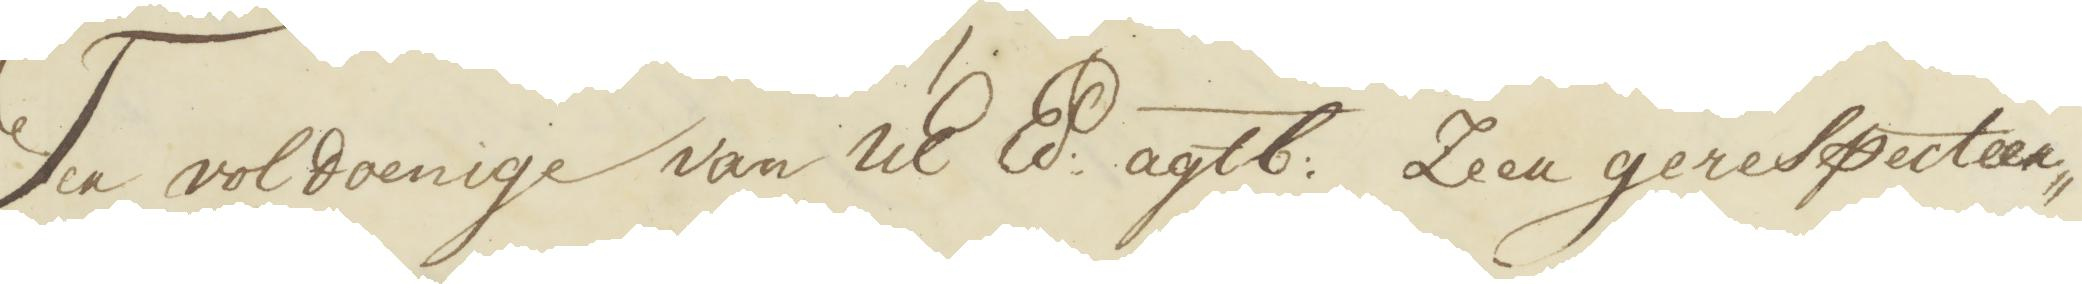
Ter voldoenige van UE Ed: agtb: zeer gerespecteer„
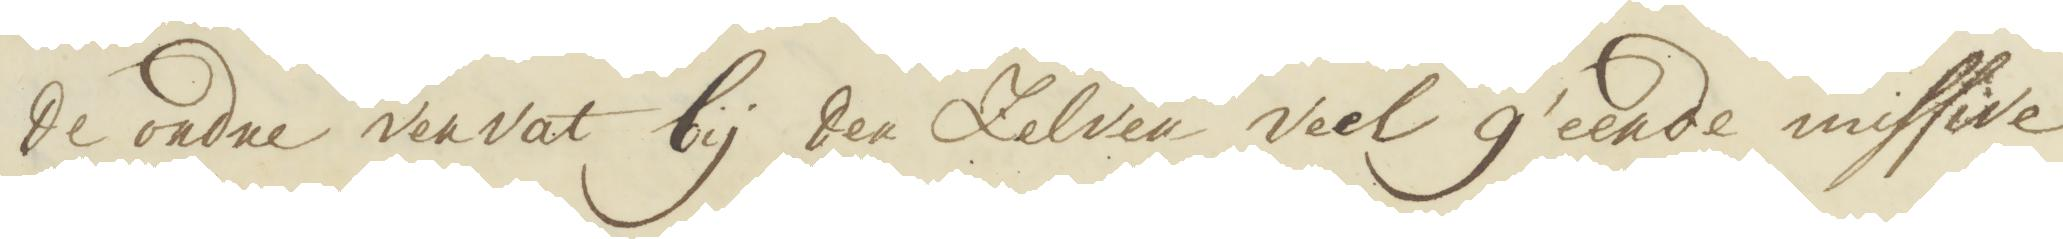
de ordre vervat bij der zelven veel g’eerde missive
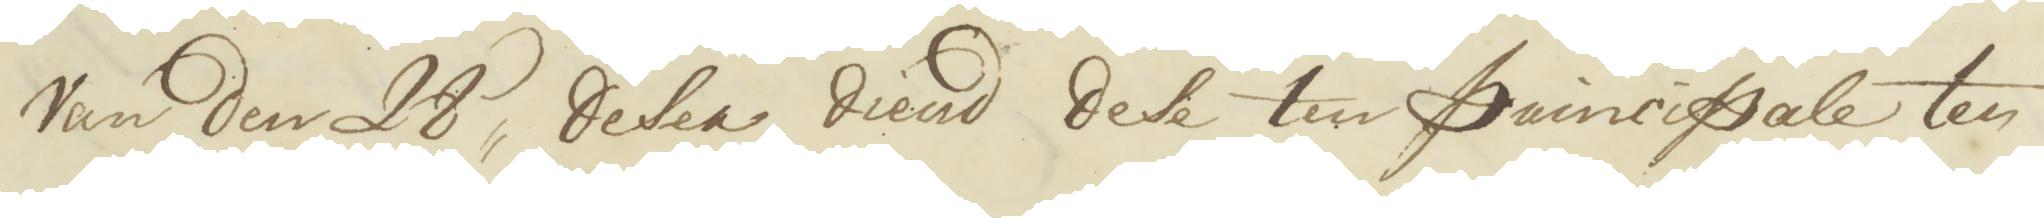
van den 28„' deser diend dese ten principale ten
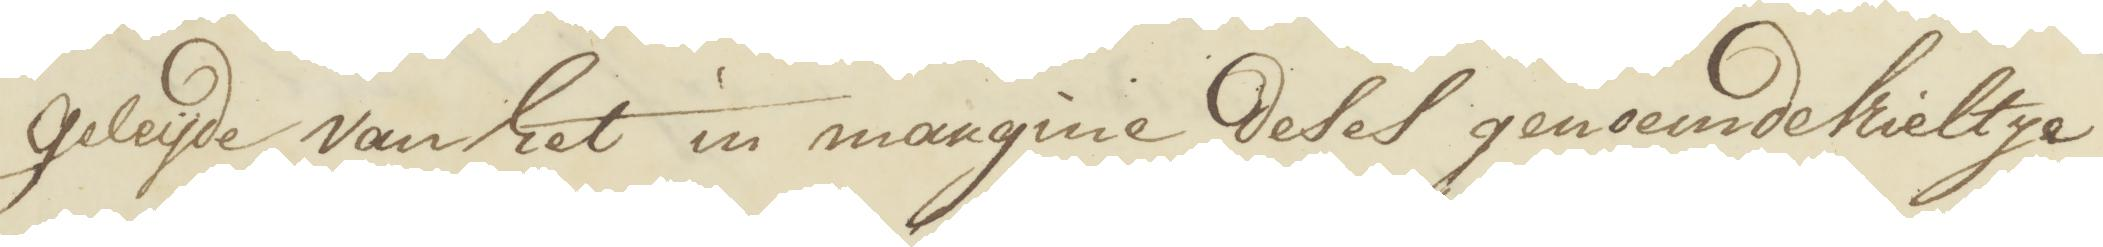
geleijde van het in margine deses genoemde kieltje
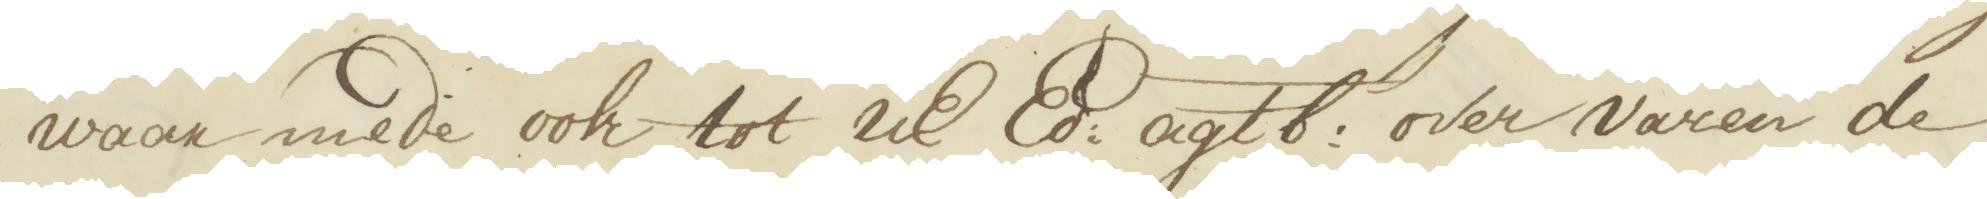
waar mede ook tot UE Ed: agtb: over varen de
